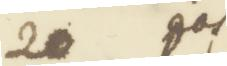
20 d:os
